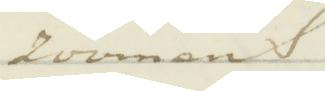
zoomers
